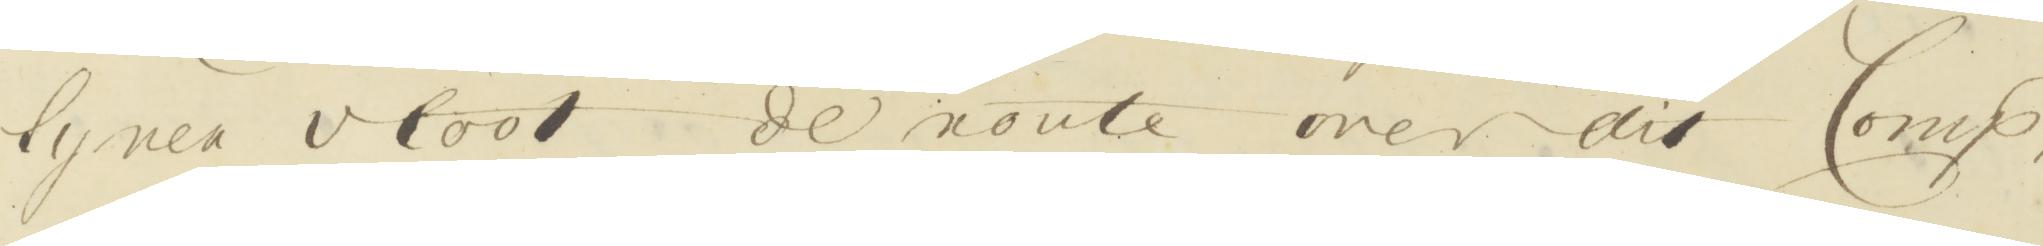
Syner vloot de route over dit Comp
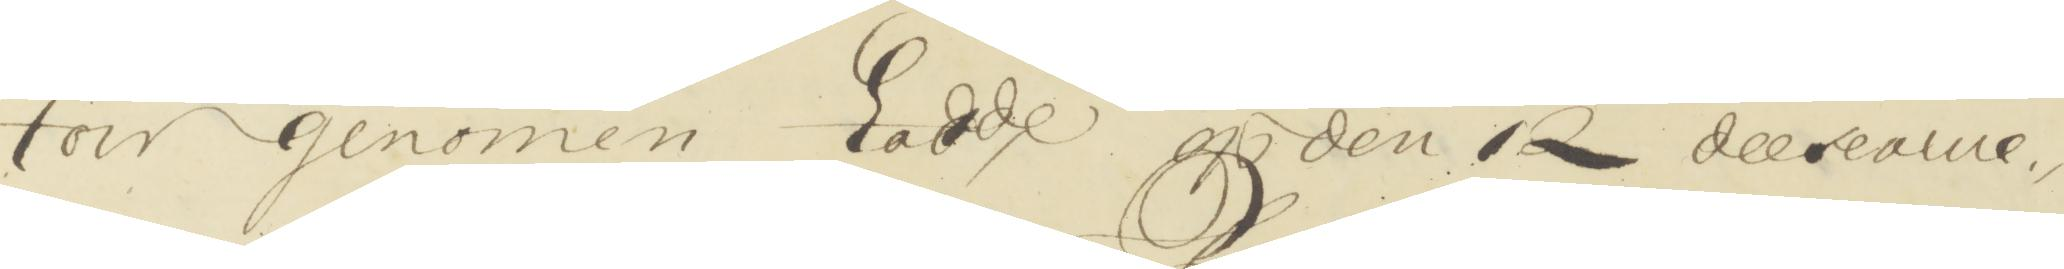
toir genomen hadde op den 12 deeser we„
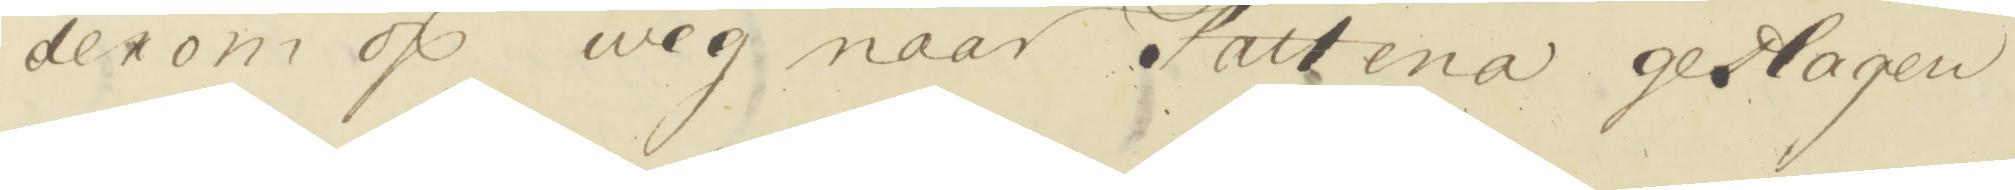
derom op weg naar Pattena geslagen
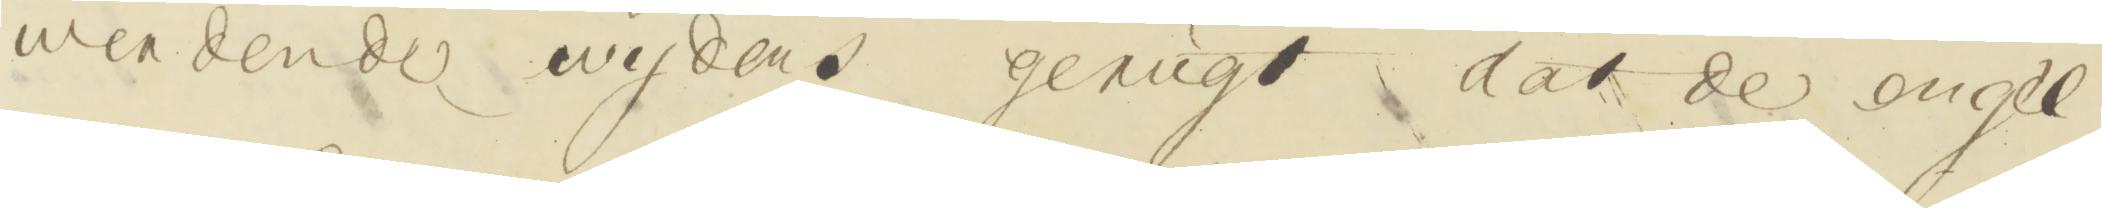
werdende wyders gerugt dat de engel
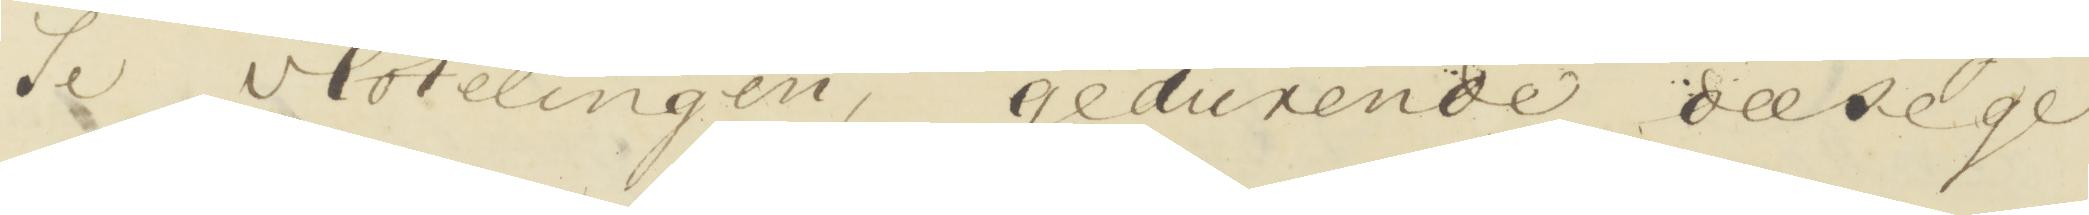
Se vlotelingen, gedurende deese ge
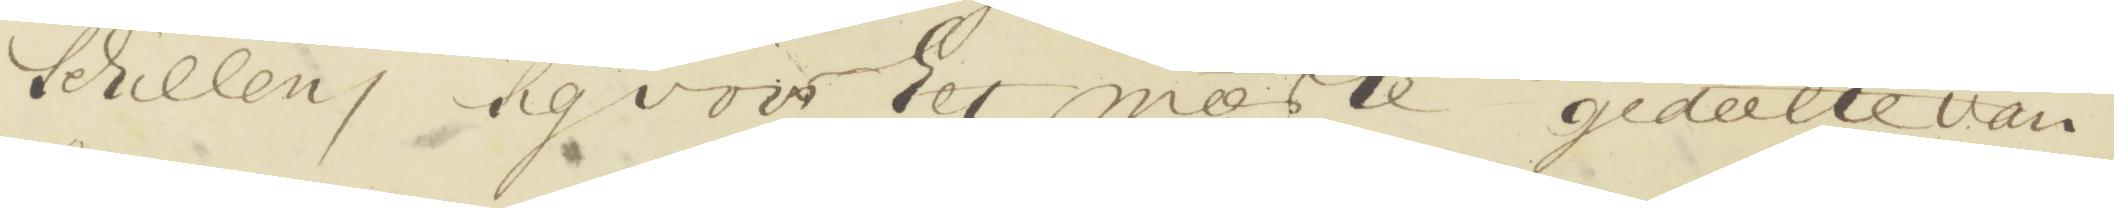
schillen, sig voor het meeste gedeelte van
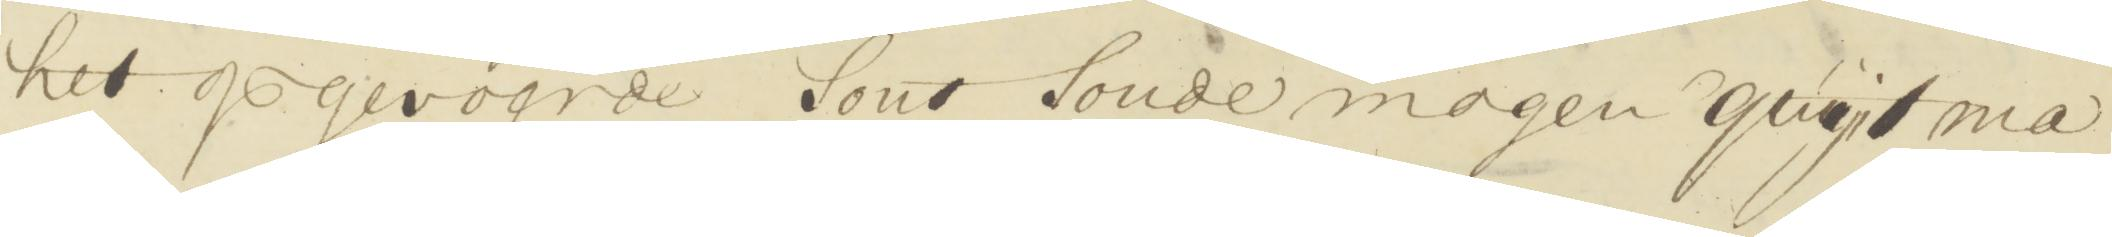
het opgevoerde Sout Soude mogen quijt ma
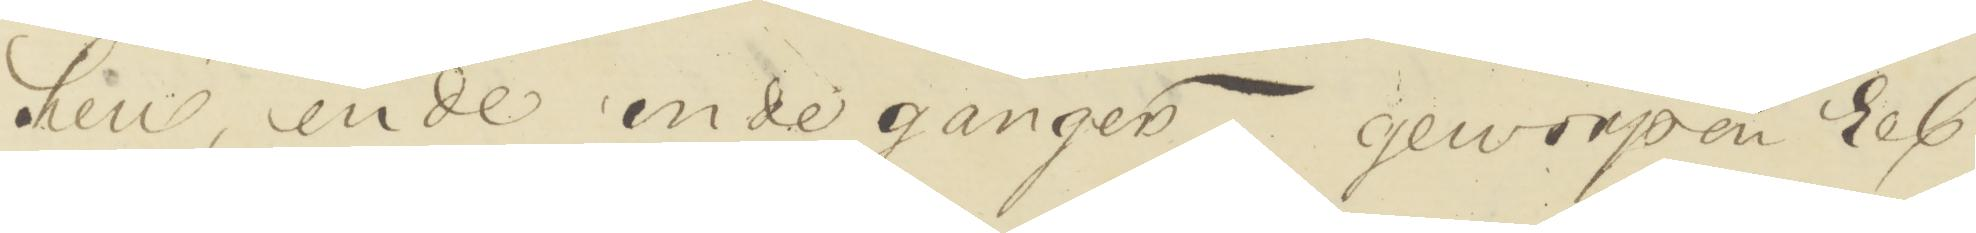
ken ende in de ganges geworpen heb
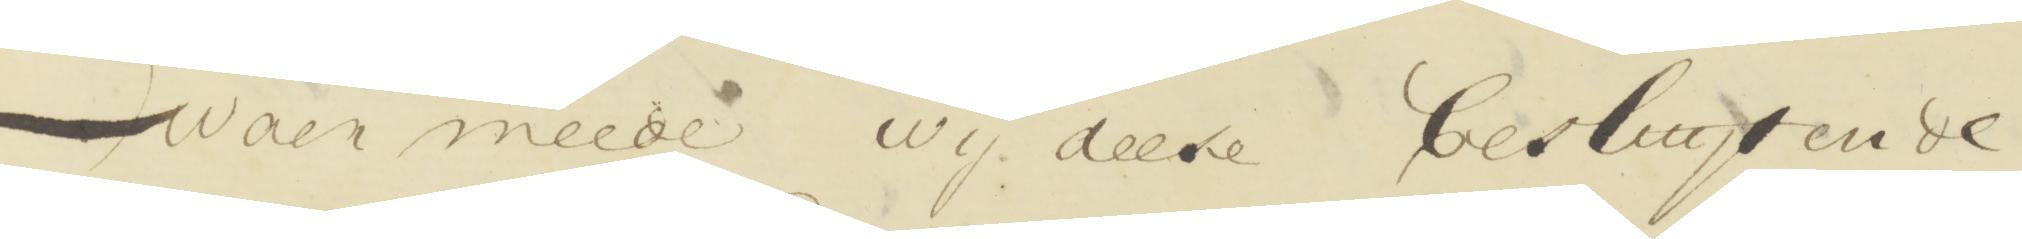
waer meede wy deese besluytende
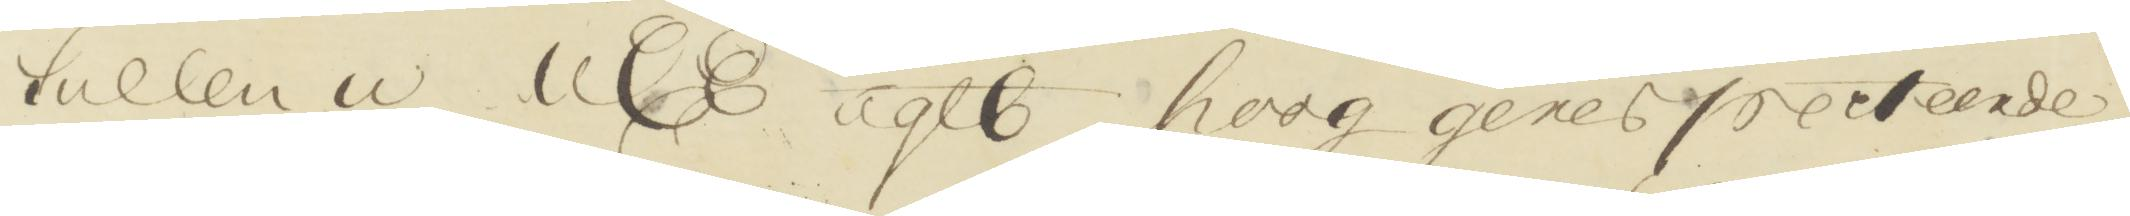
Sullen w VEE agtb hoog gerespecteerde
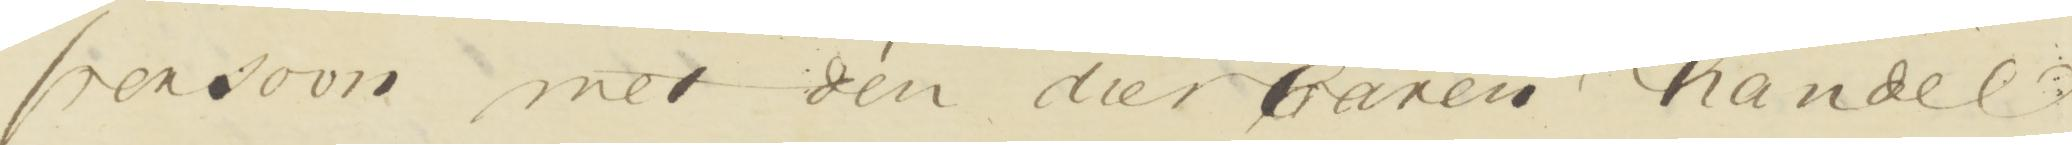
persoon met den dierbaren handel
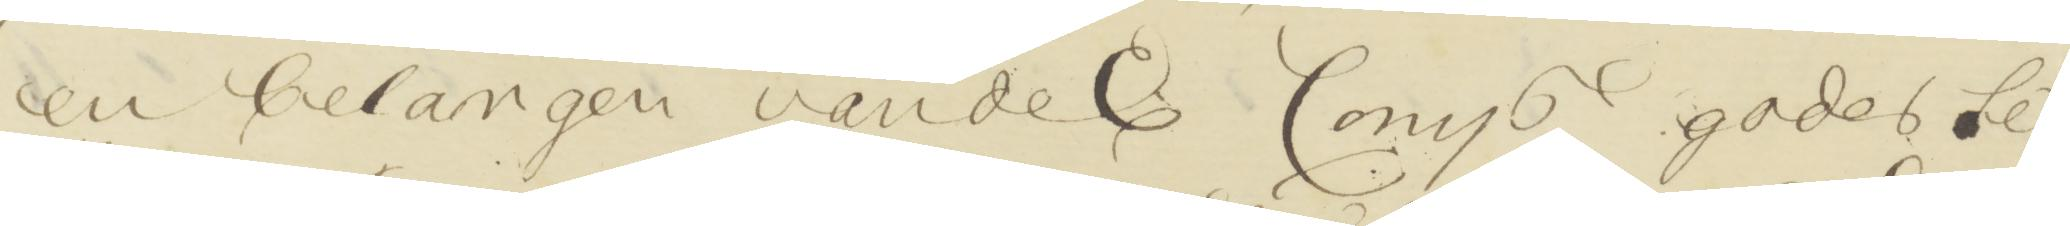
en belangen van de E Comp:e godes Se
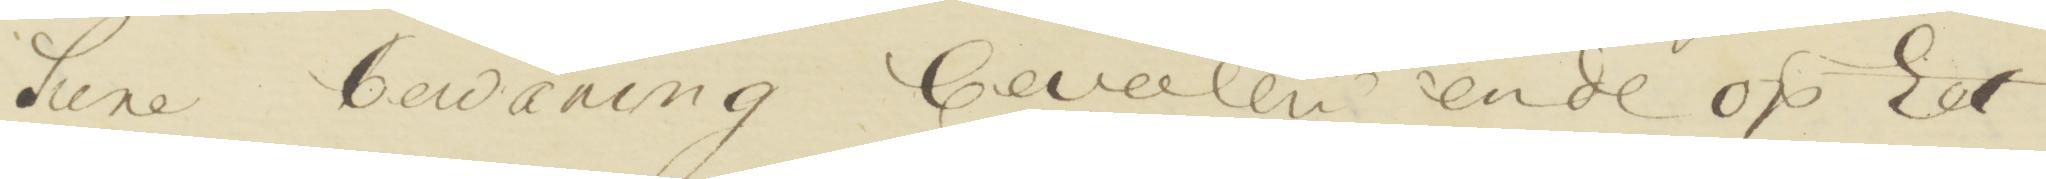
kere bewaring beveelen ende op het
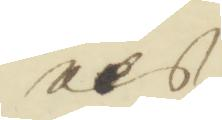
res
